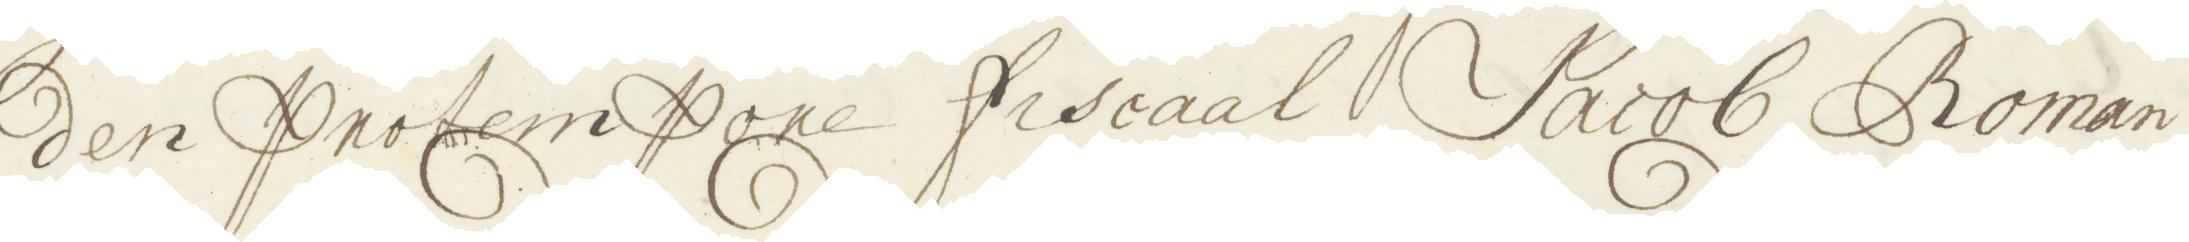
den protempore fiscaal Iacob Roman
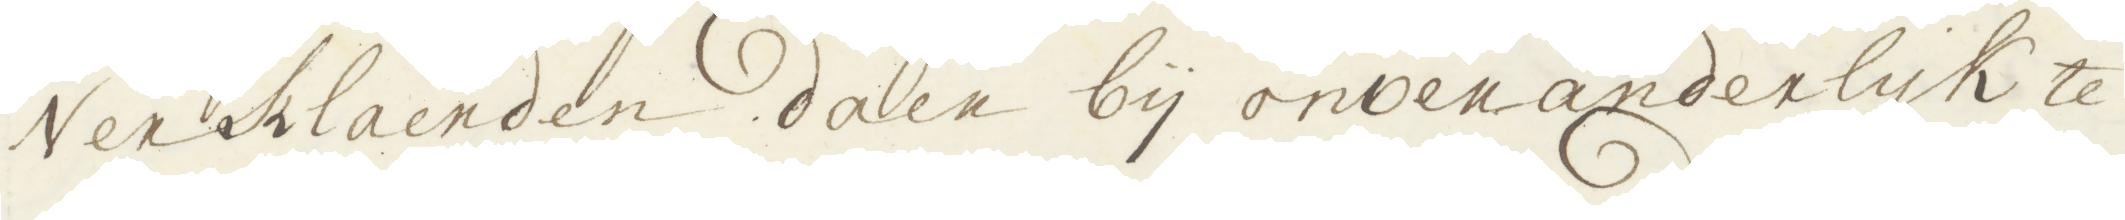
verklaerden daer bij onveranderlijk te
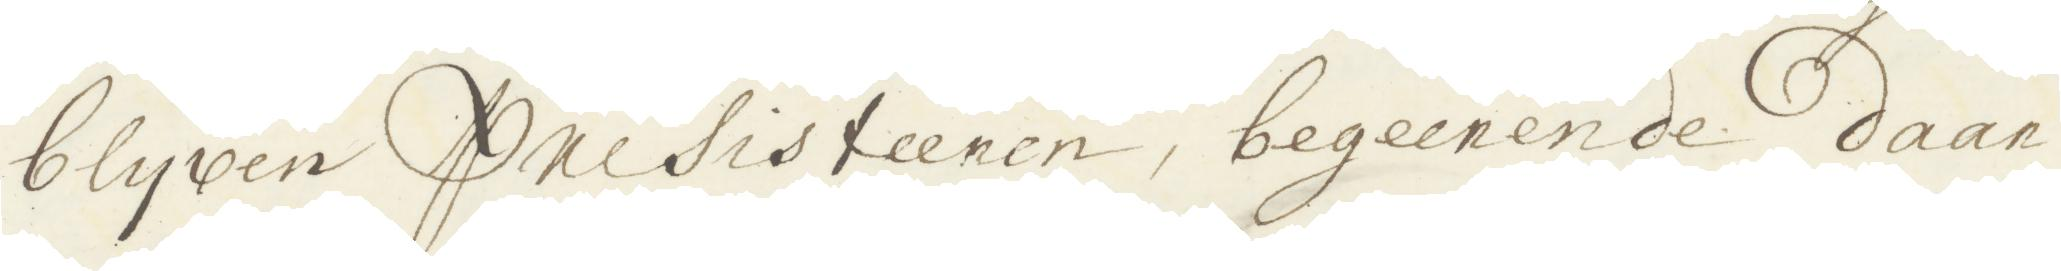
blijven Presisteeren, begeerende daar
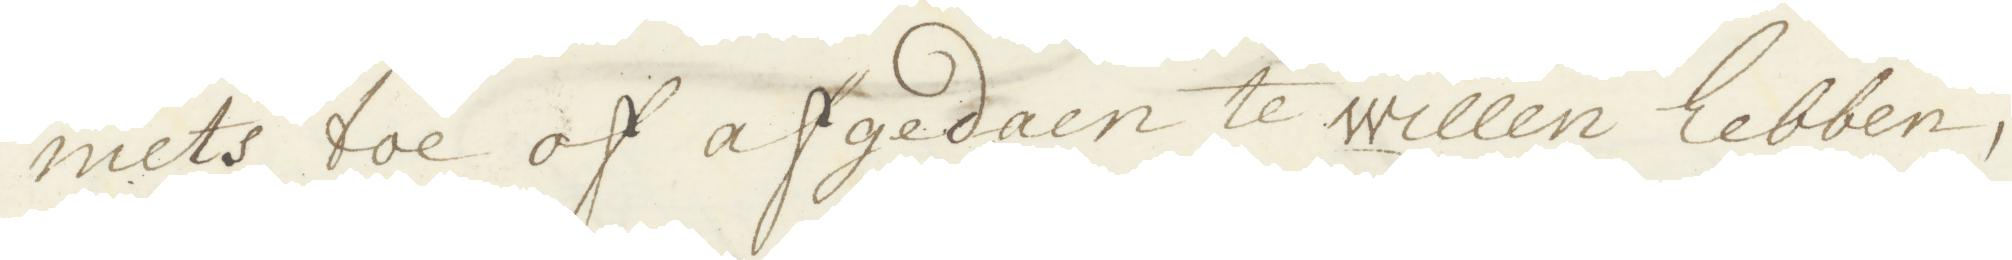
niets toe of afgedaen te willen hebben
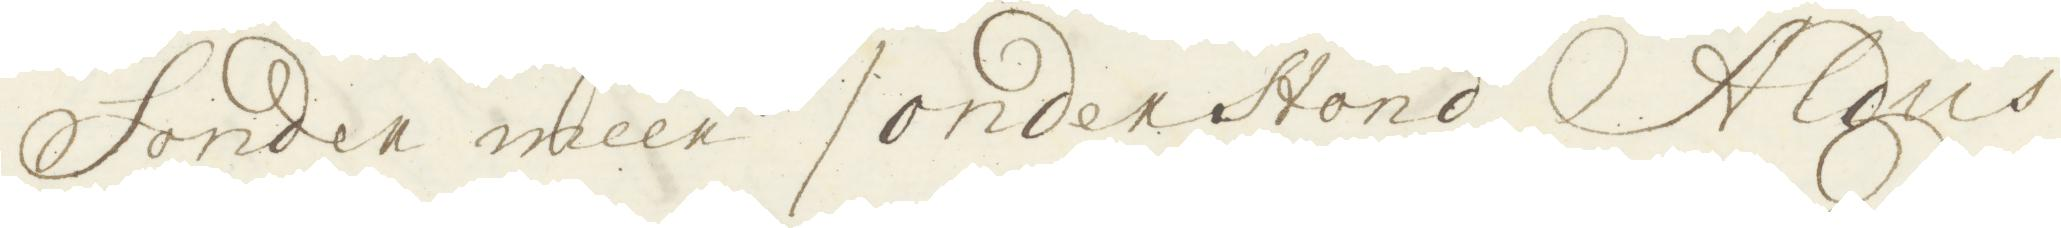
sonder meer / onderstond Aldus
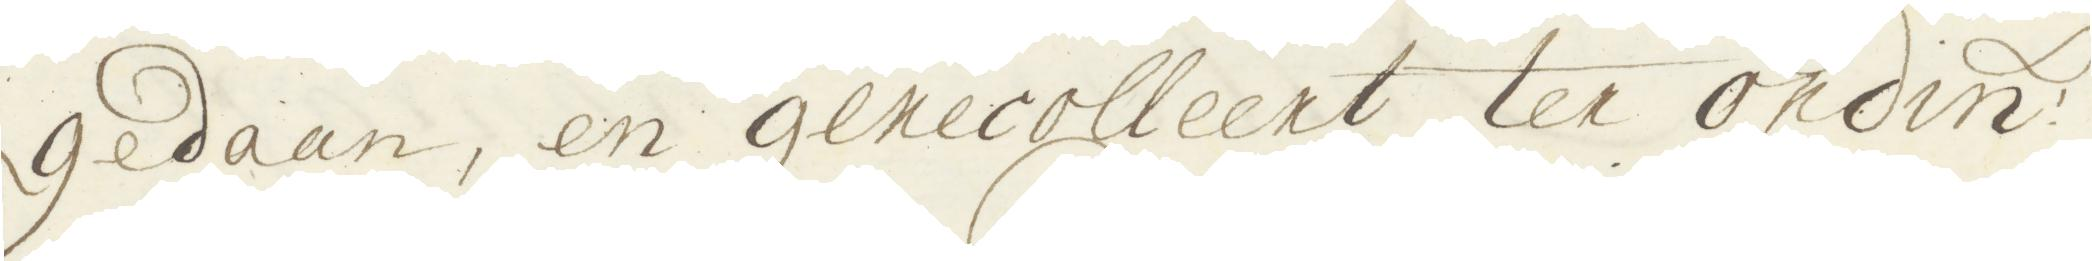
gedaan, en gerecolleert ter ordin:
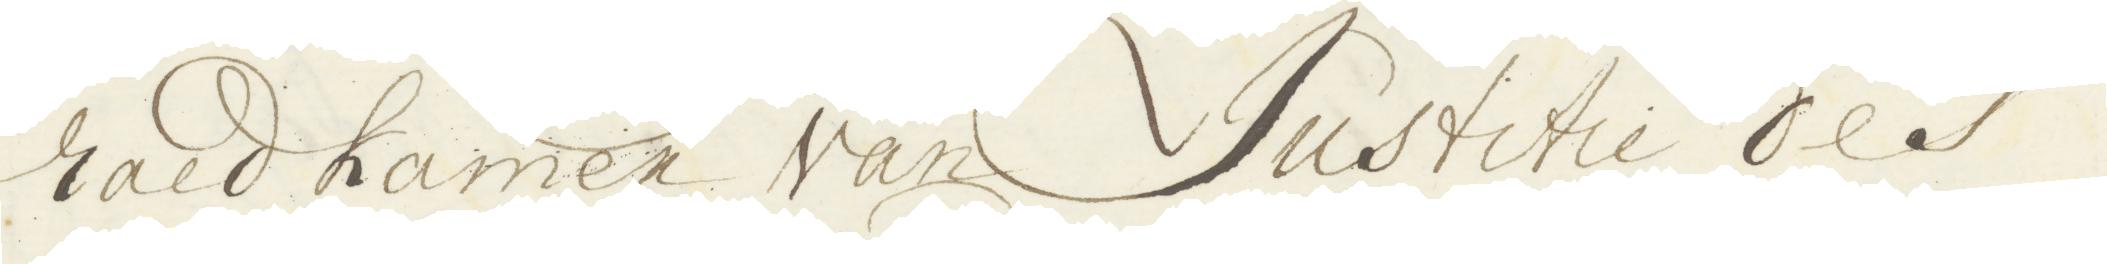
raedkamer van Iustitie des
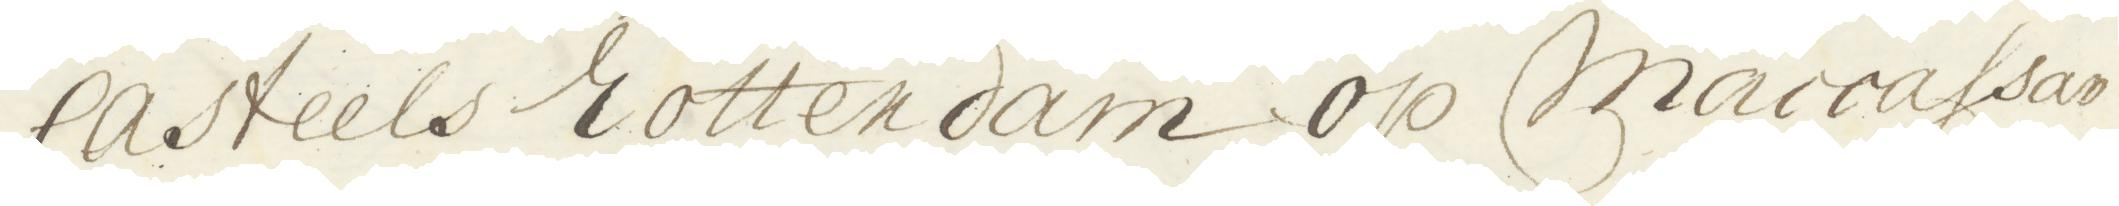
Casteels rotterdam op Maccassar
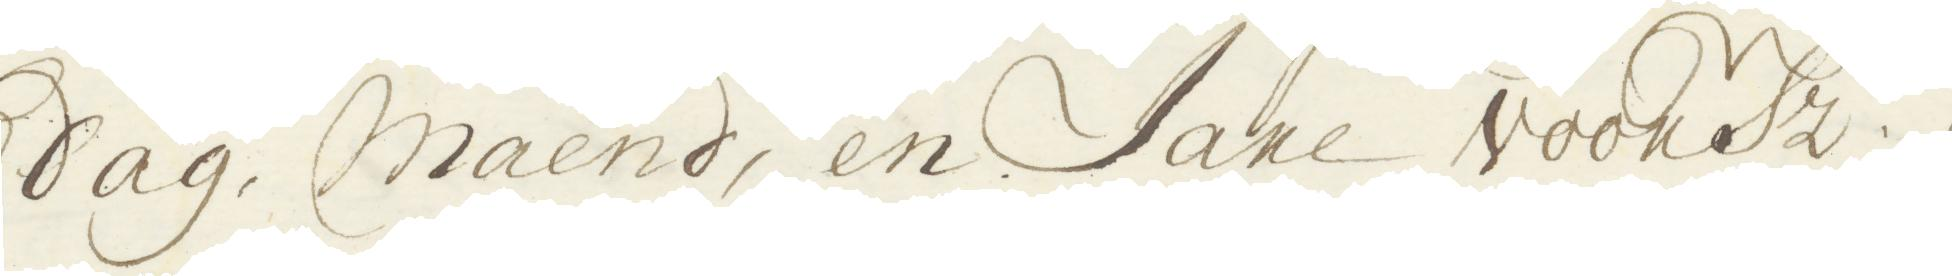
dag, maend, en Iare voorsz:
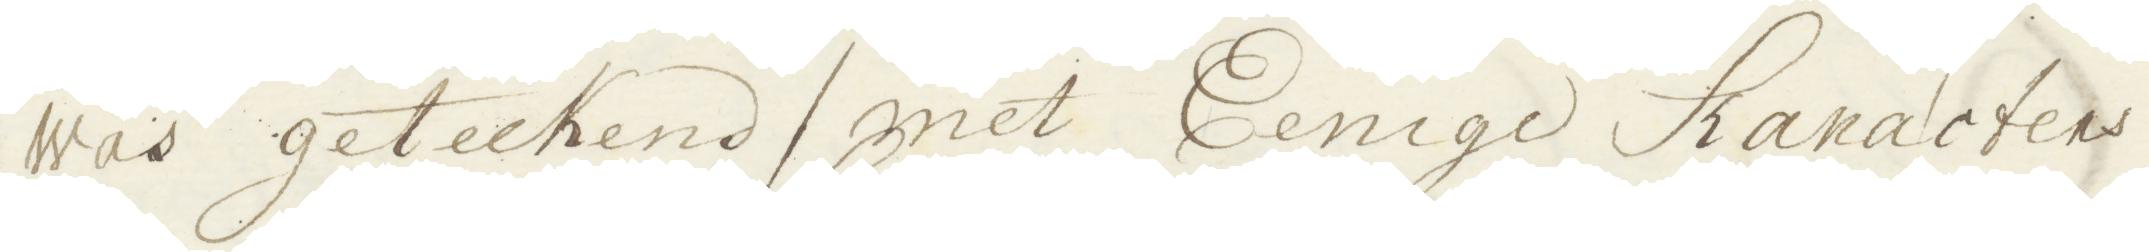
was geteekend / met Eenige Karacters
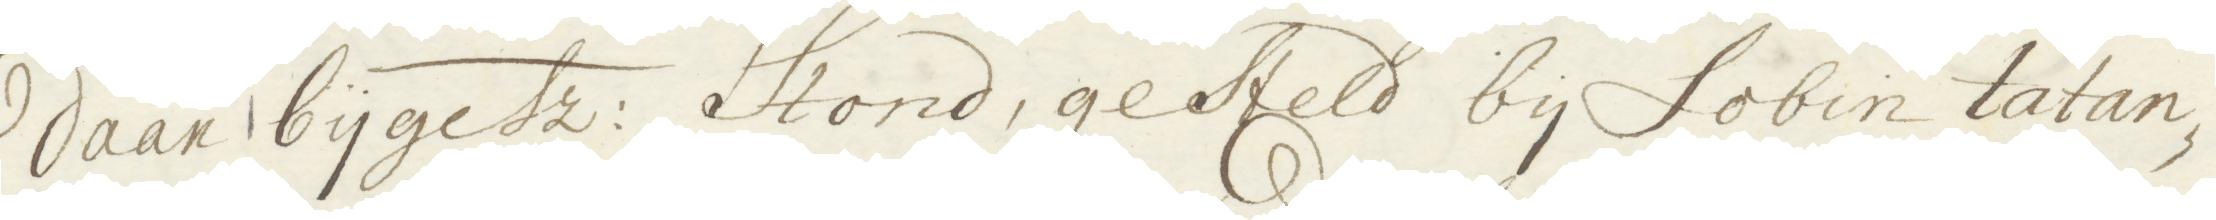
daar bij gesz: stond, gesteld bij sobin tatan„
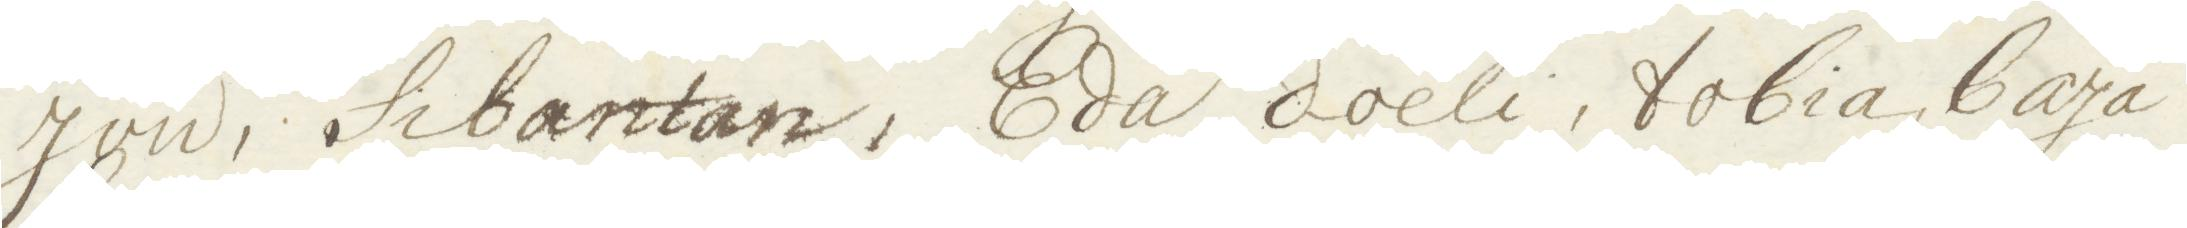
jow, sibantan, Eda doeli, tobia, baja
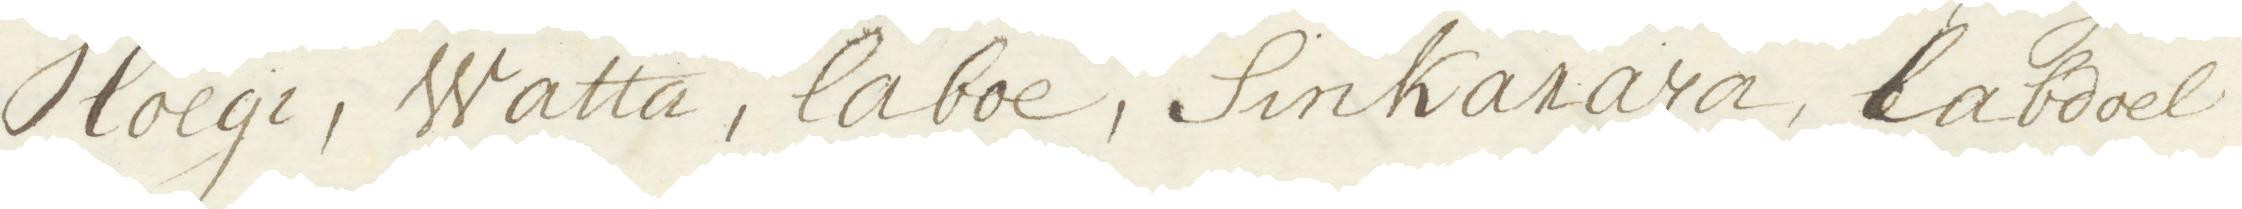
loegi, Watta, laboe, Sinkaraja, labdoel
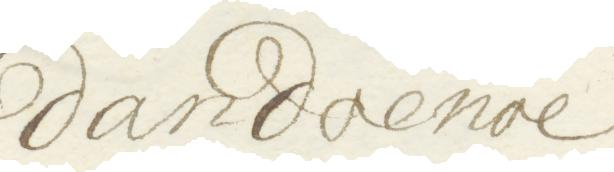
dan doenoe
